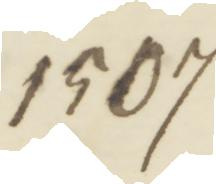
1507
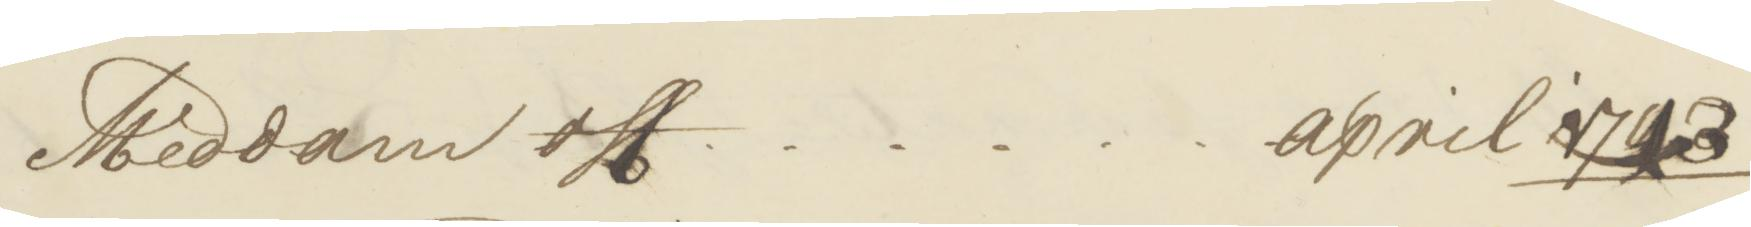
Meddam off - - - - - - april 1743
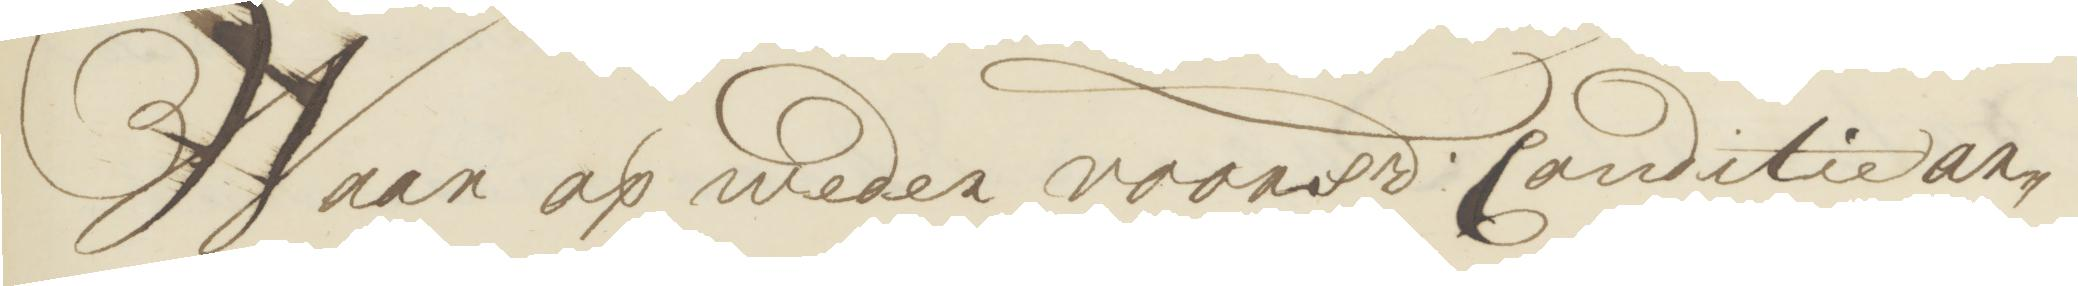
Waar op weder voorsz: Conditie ar„
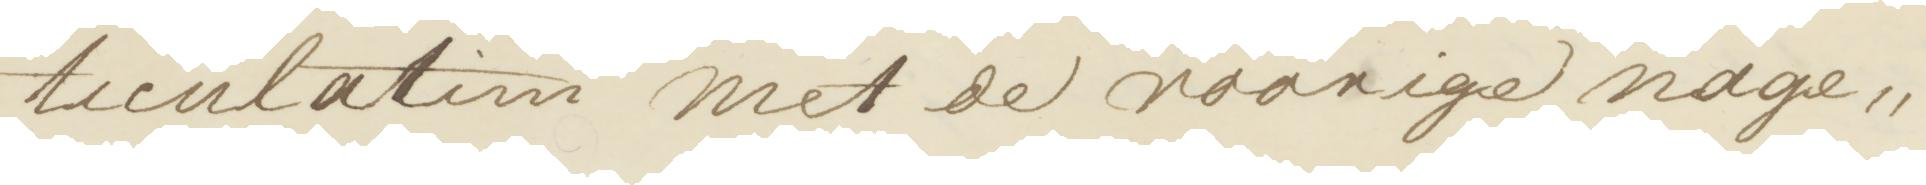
ticulatim met de voorige nage„
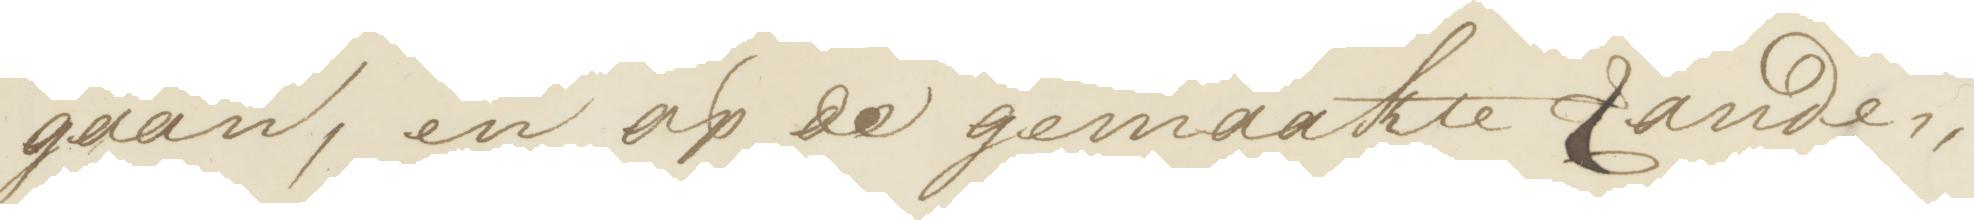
gaan, en op de gemaakte verande„
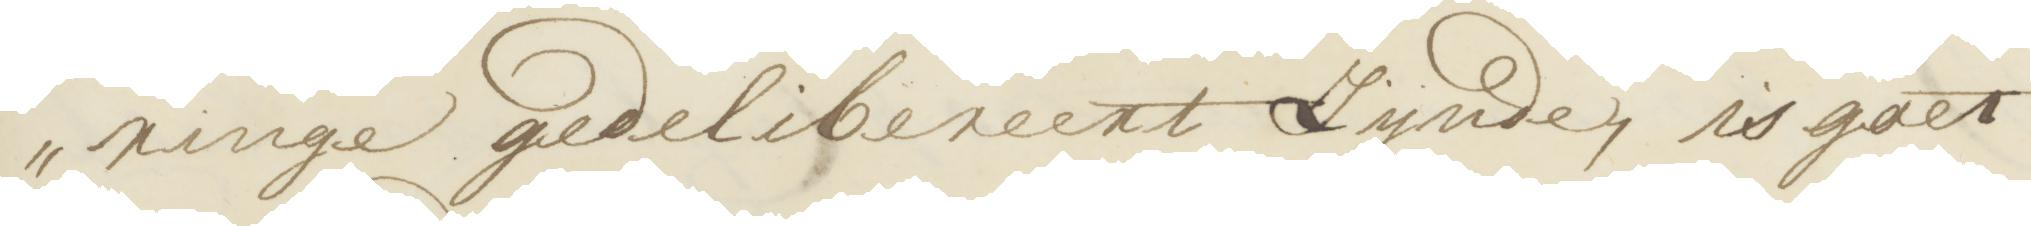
„ringe gedelibereert zijnde, is goet
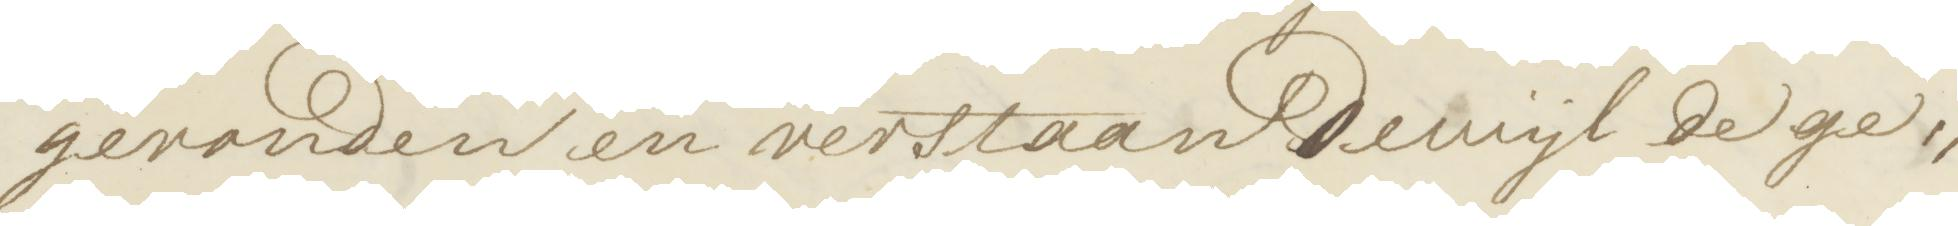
gevonden en verstaan dewijl de ge„
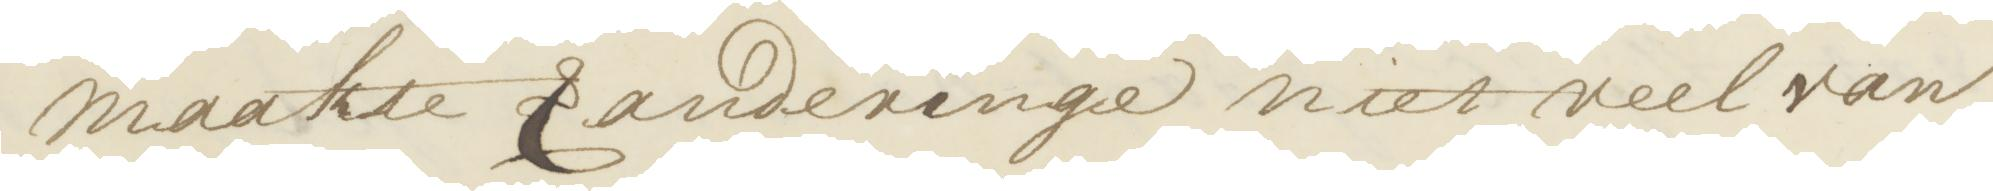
maakte veranderinge niet veel van
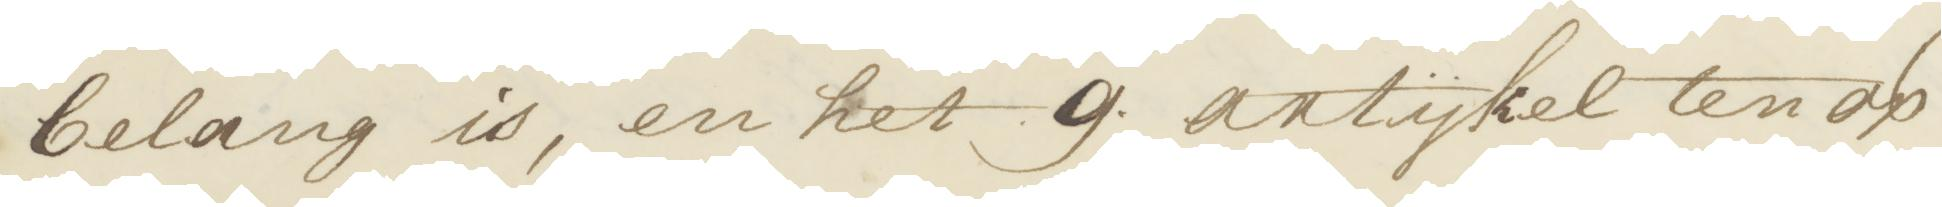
belang is, en het 9. artijkel ten op
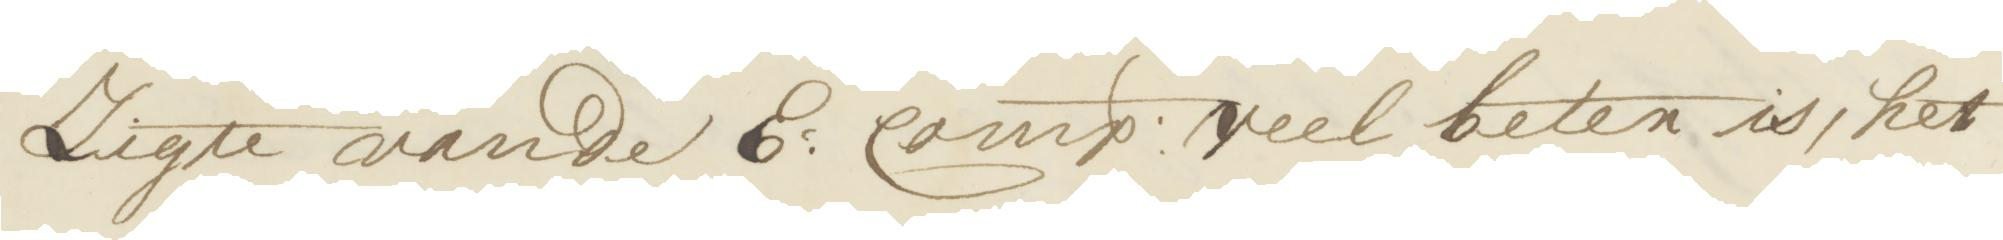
zigte van de E: Comp: veel beter is, het
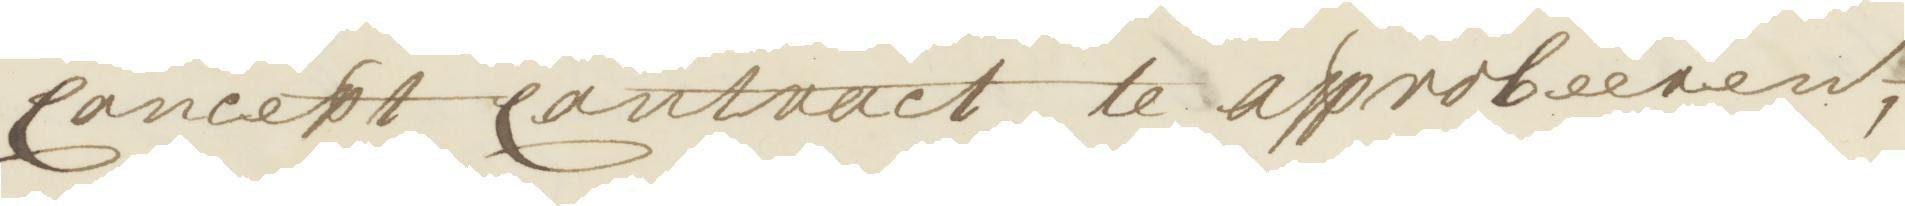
Concept Contract te approbeeren,
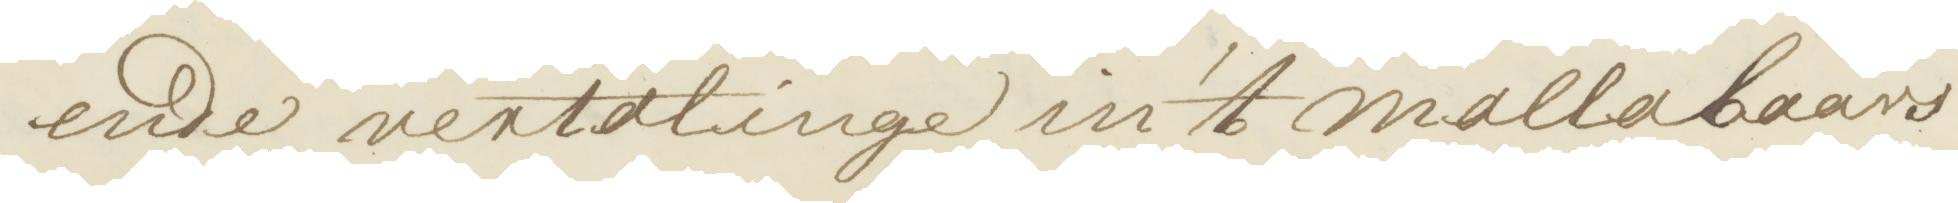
ende vertalinge in ’t mallabaars
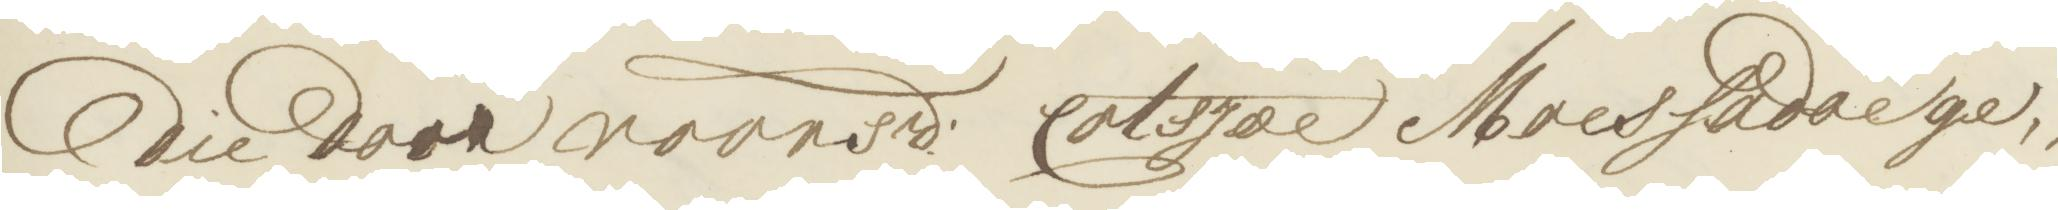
die door voorsz: Cotsjoe Moessadoe ge„
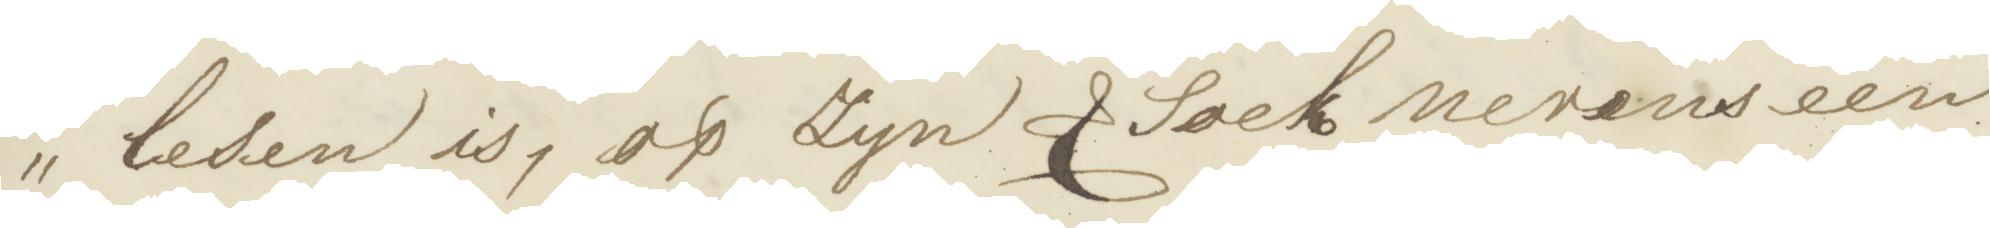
„ lesen is, of zyn versoek nevens een
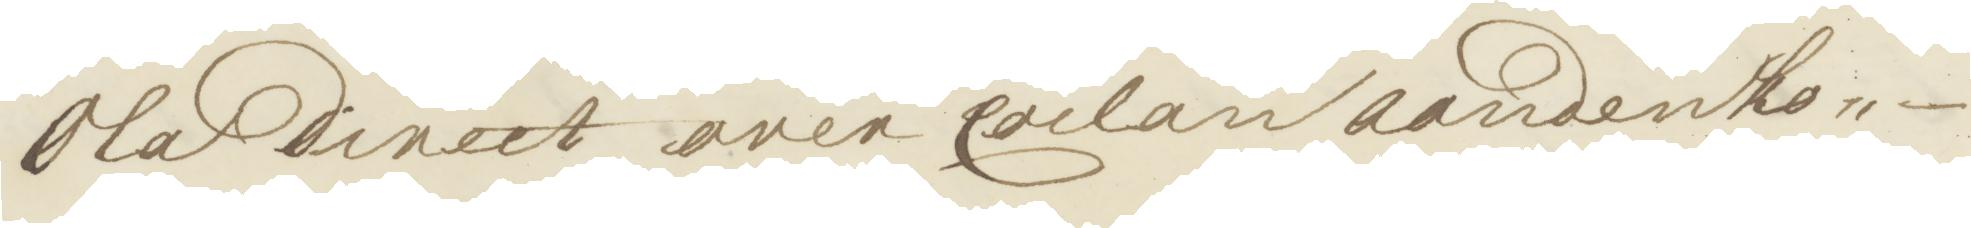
Ola direct over Coilan aanden ko„—
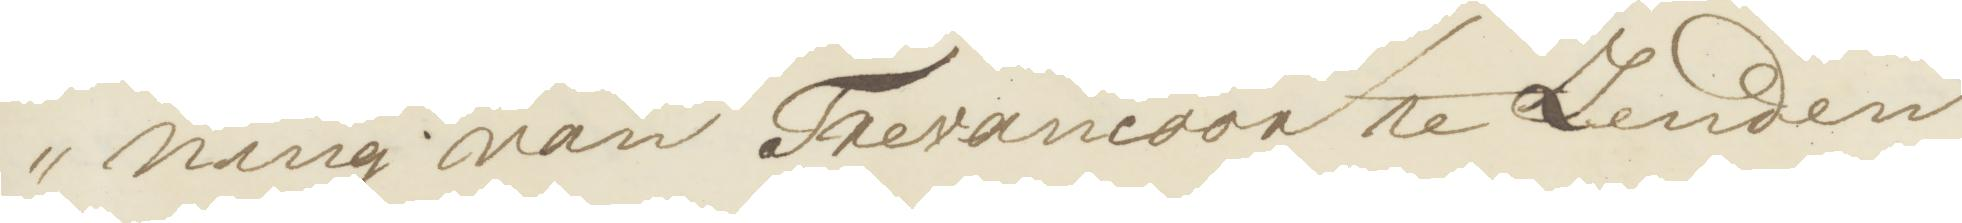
„ning van Trevancoor te zenden
